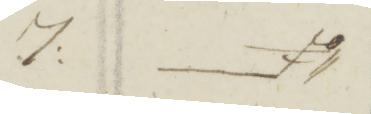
7: _„o
